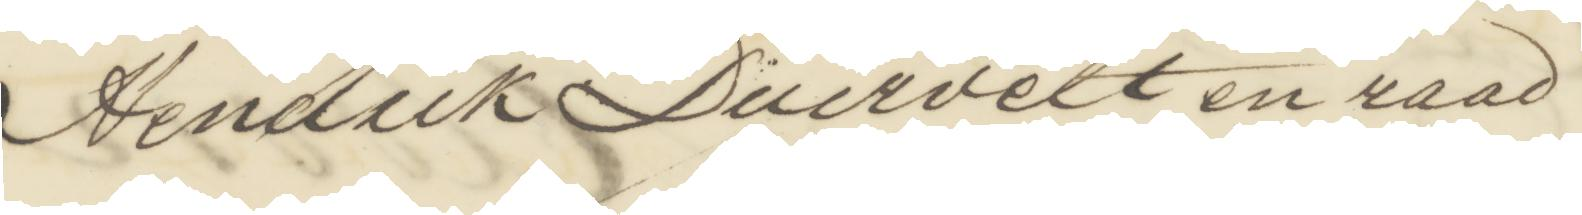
Hendrik Duirvelt en raad
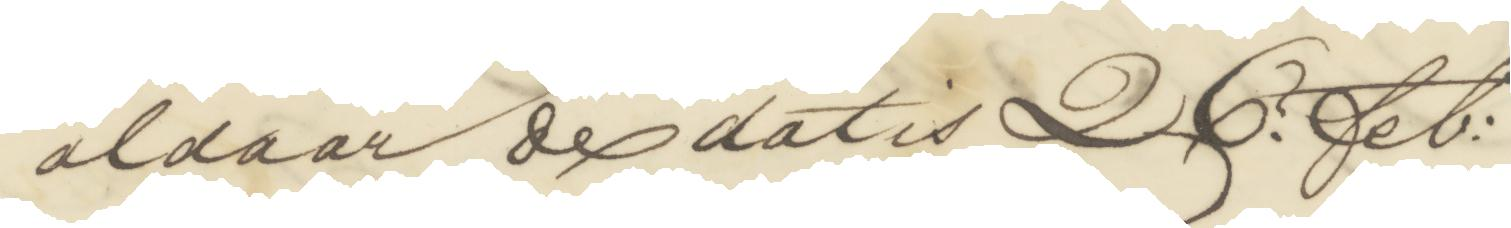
aldaar de datis 26:en feb:
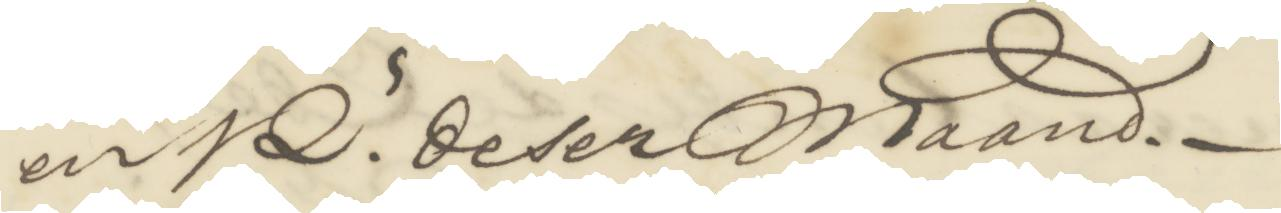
en 12.´ deser Maand. —
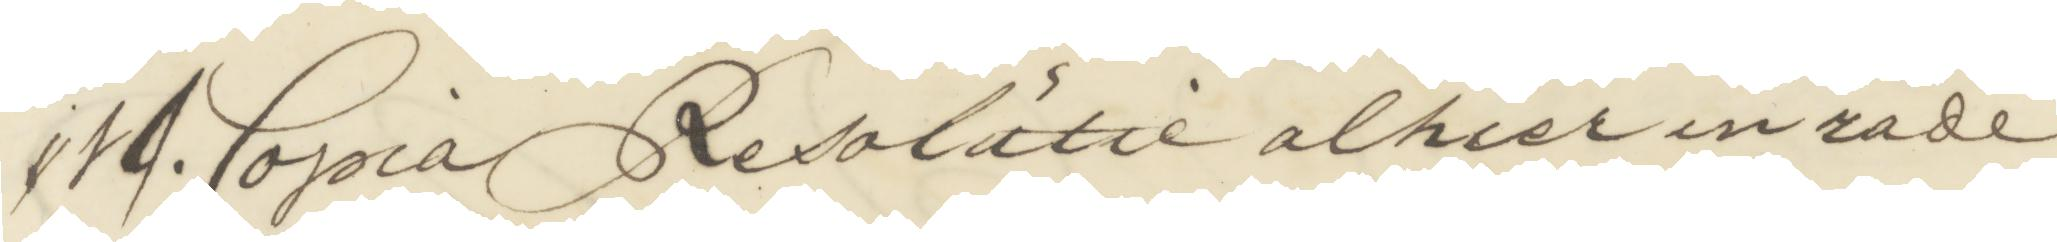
14. Copia Resolutie alhier in rade
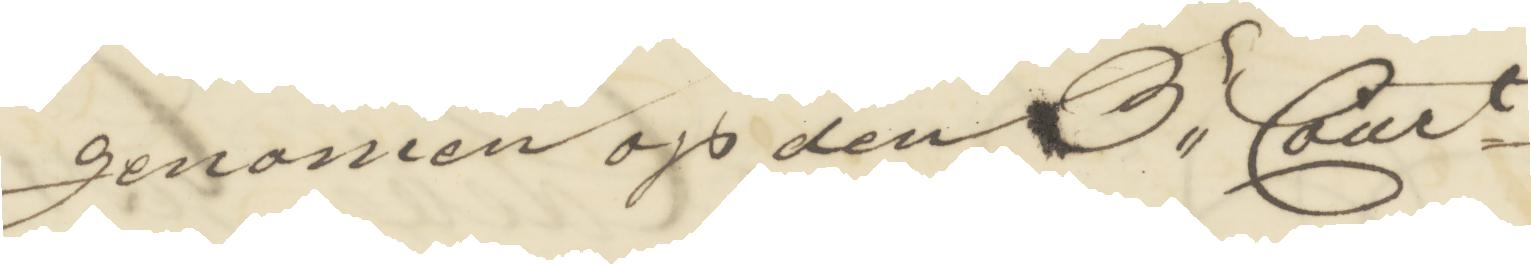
genomen op den 3„´ Cour=t
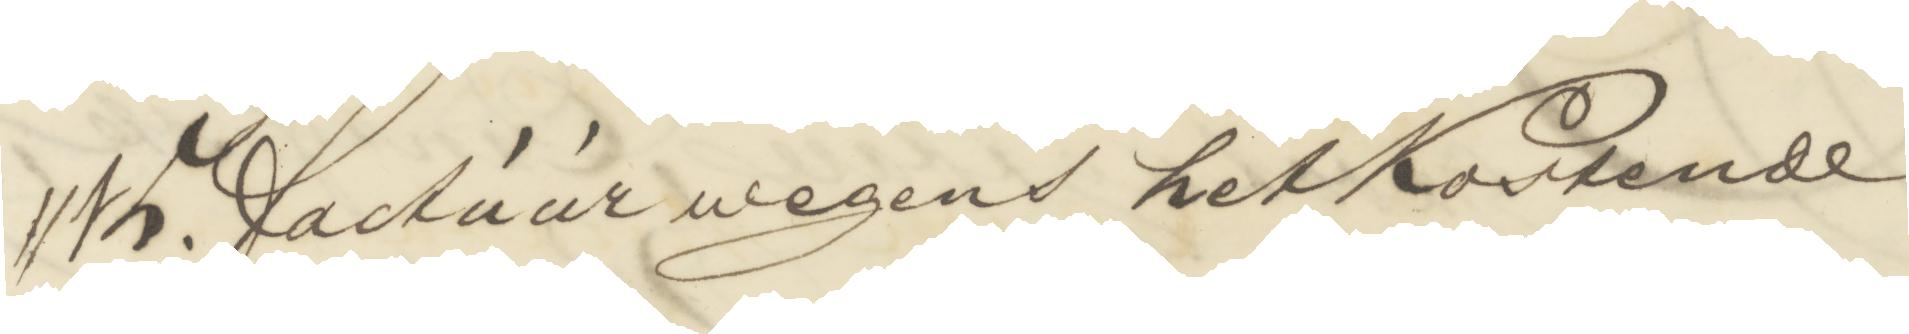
„ 15. factuur wegens het Kostende
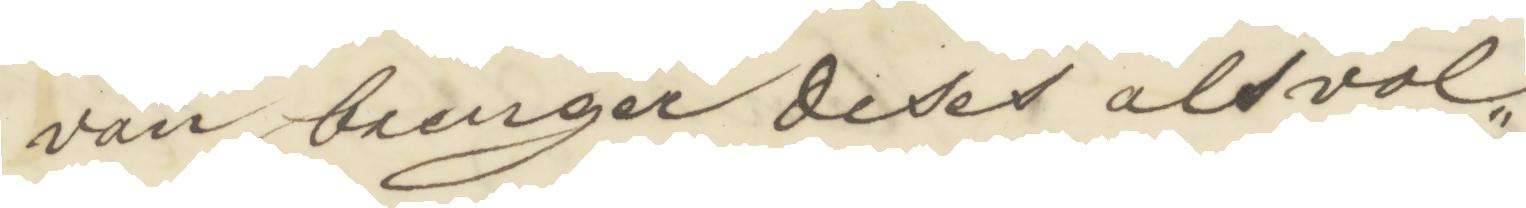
van brenger deses als vol„
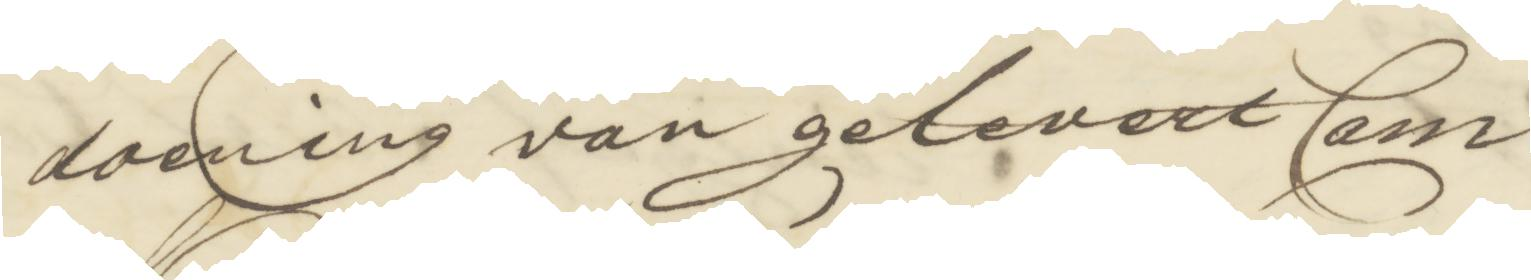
doening van gelevert Cam
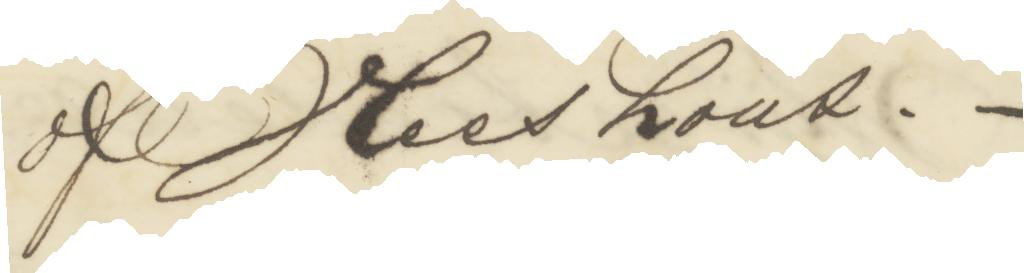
of Vlees hout. —
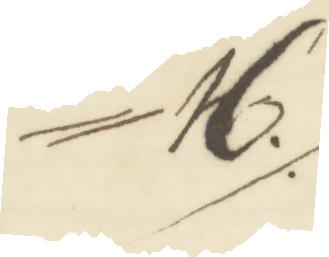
N„o 16./.
